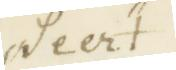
seert
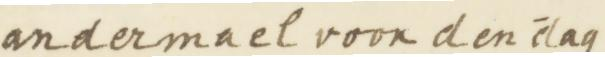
andermael voor den dag
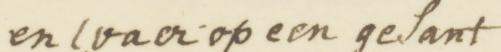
en waer op een gesant
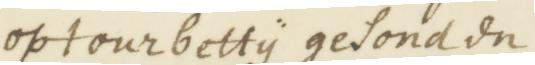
op tourbettij gesonden
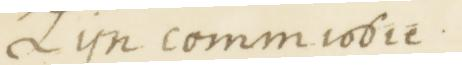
zijn commissie
